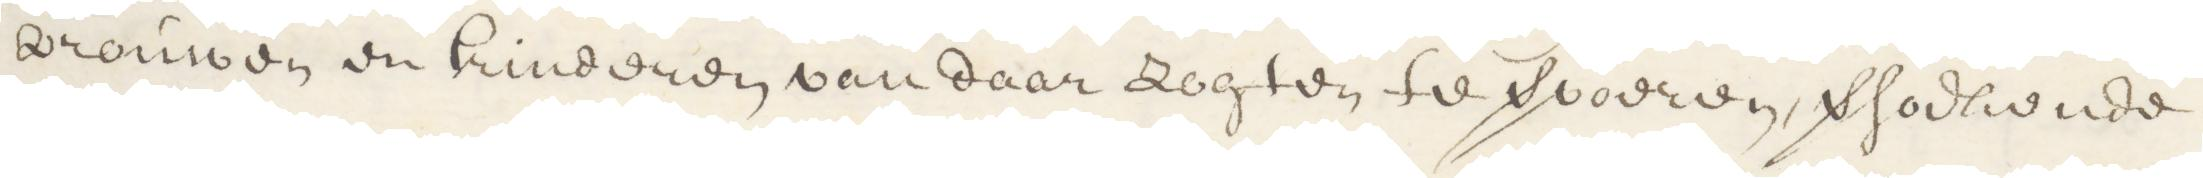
vrouwen en kinderen van daar zogten te vervoeren, versoekende
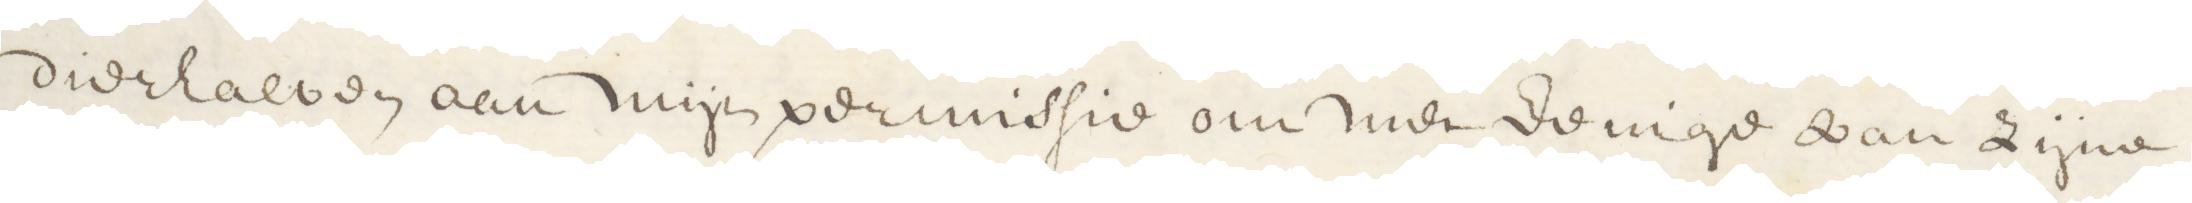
dierhalven aan mijn permissie om met Eenige van zijne
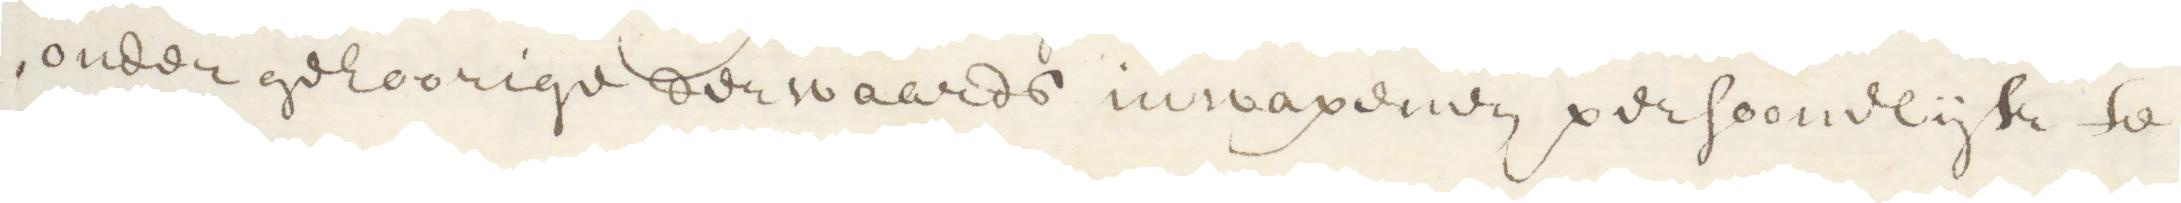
„onder gehoorige derwaards inwapenen persoonelijk te
